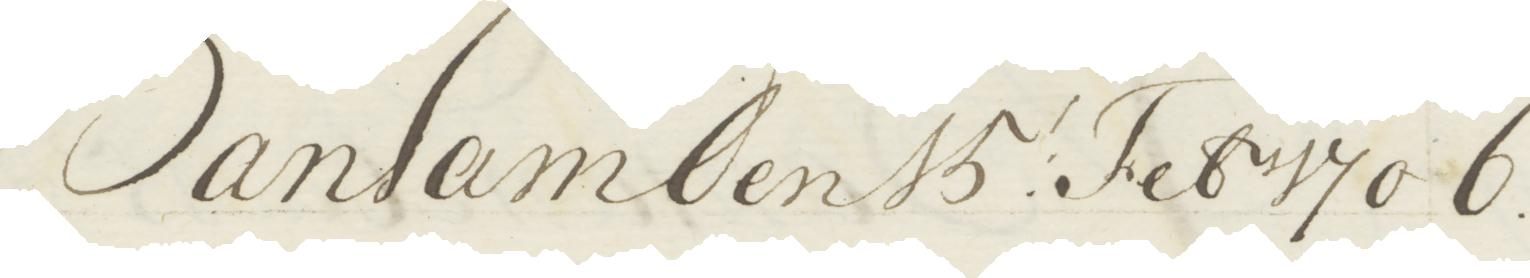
Van Bantam den 15:' Feby 1706.
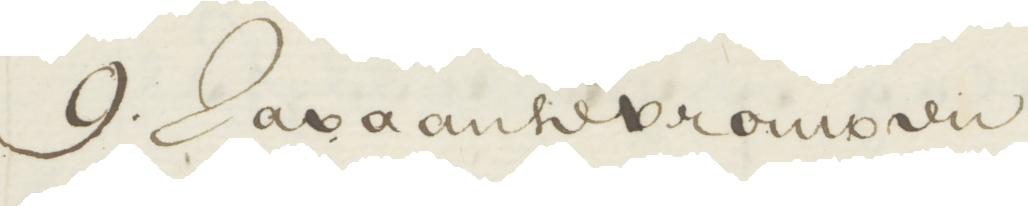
9. Javaanse vrouwen
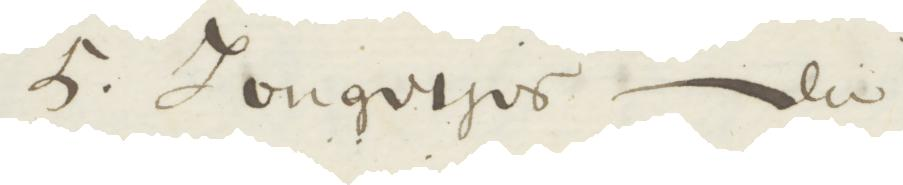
5. jongetjes en
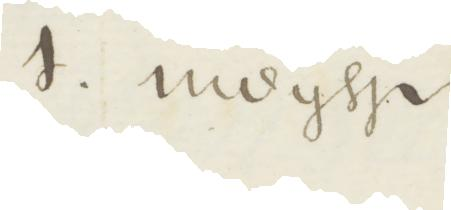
1. meijsje
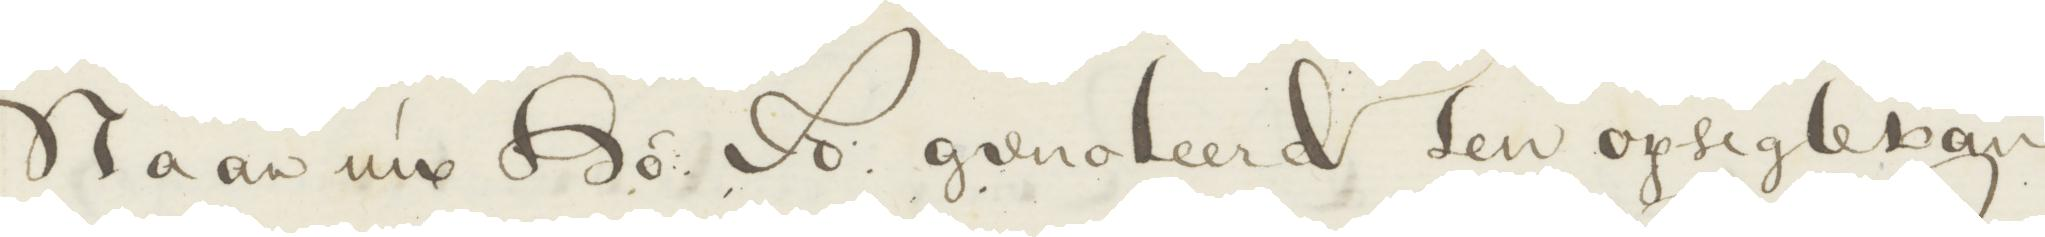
Naar uw Ho: Ed: genoteerd ten opsigte van
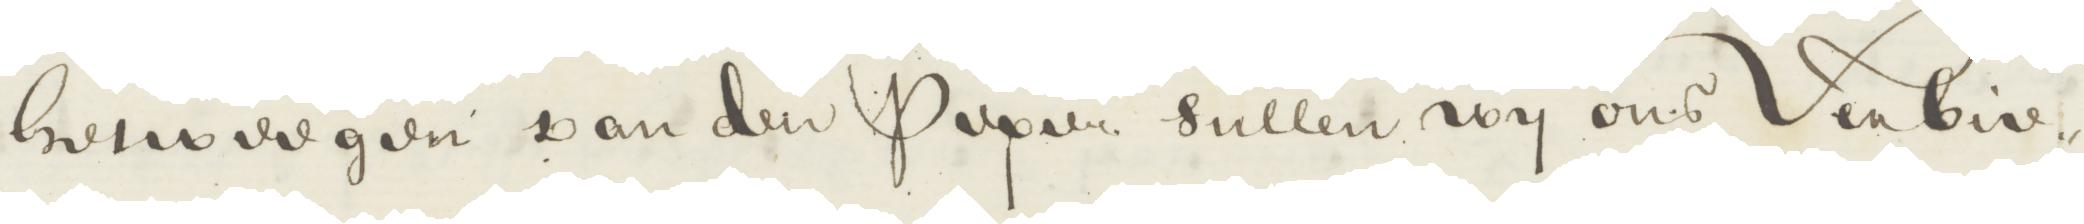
het weegen van den Peper sullen wij ons Eerbie„
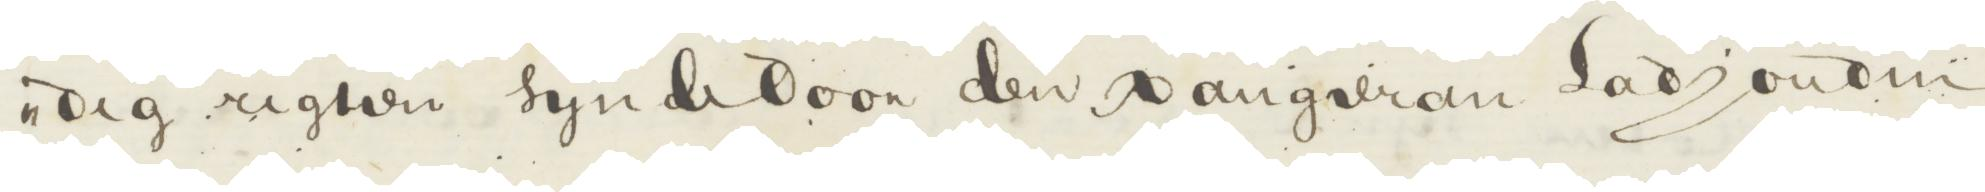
dig rigten sijn de door den pangeran tadjoudin
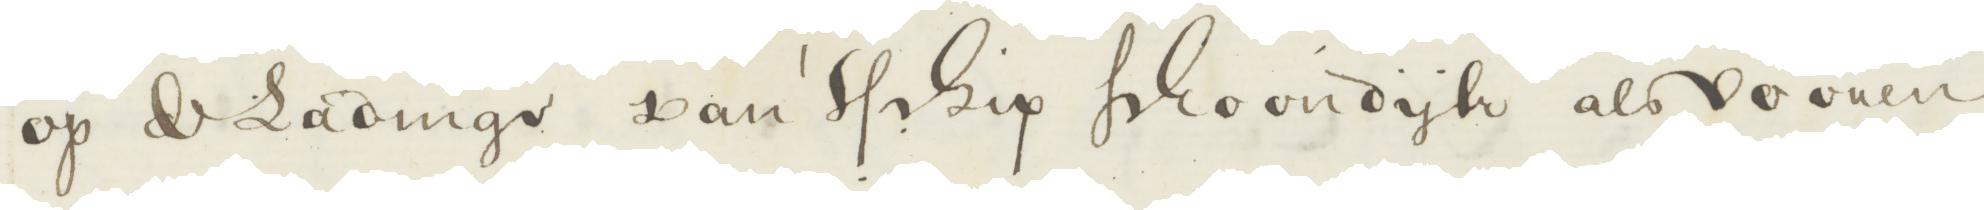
op de ladinge van 'tschip schoondijk als vooren
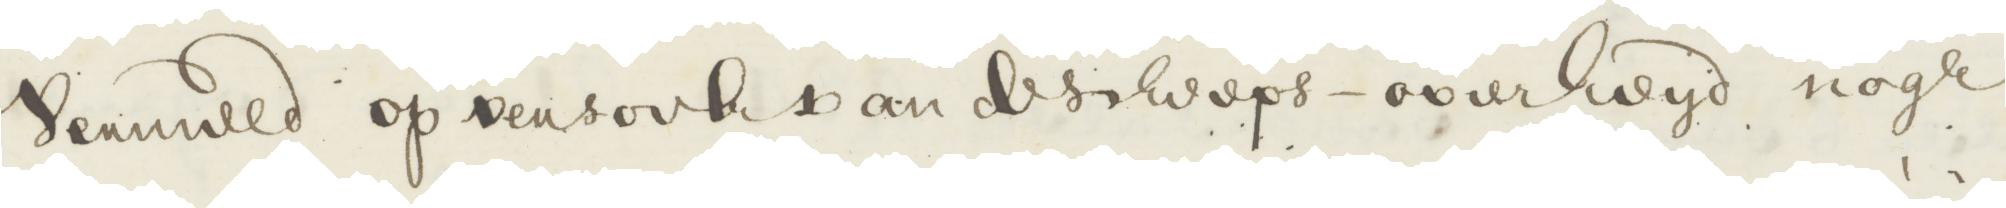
vermeld op versoek van de scheeps-overheijd nogh
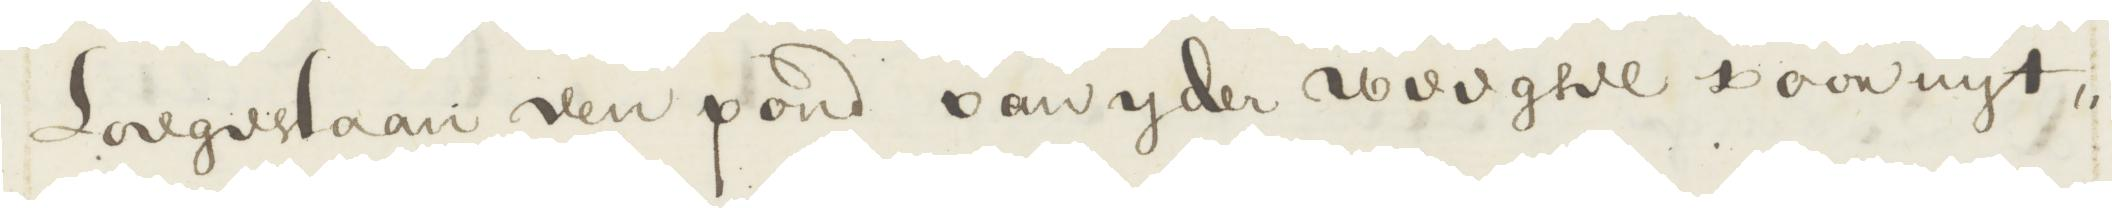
toegestaan een pond van ijder weegsel voor uijt„
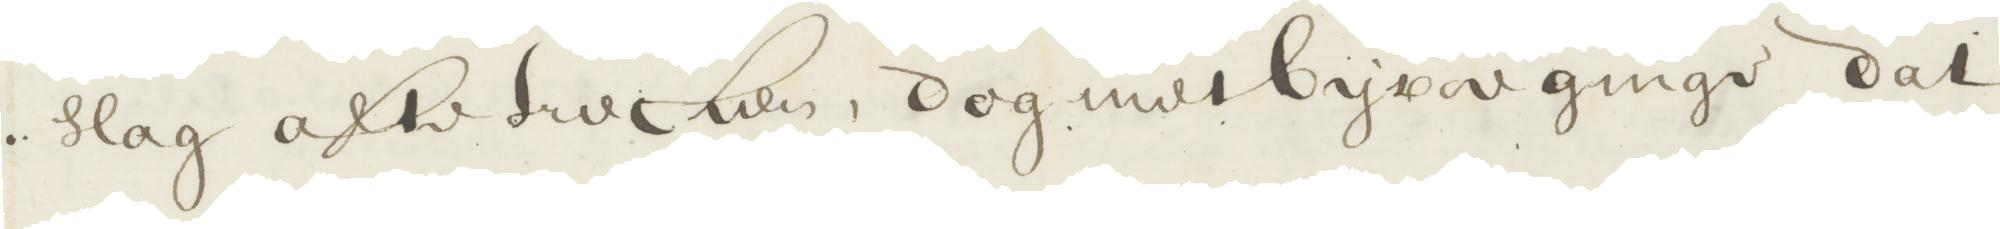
„slag afte trecken, dog met bijvoeginge dat
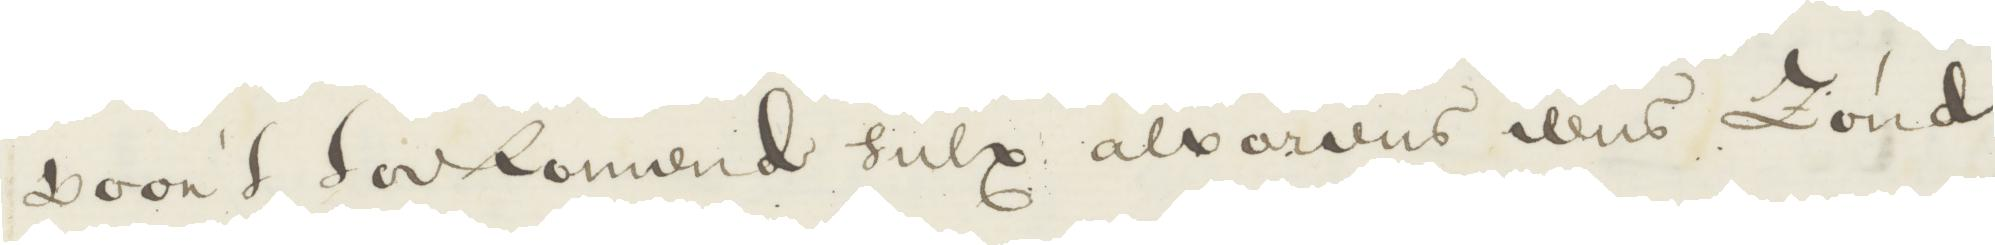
voor ’t toekomende sulx alvorens eens zoude
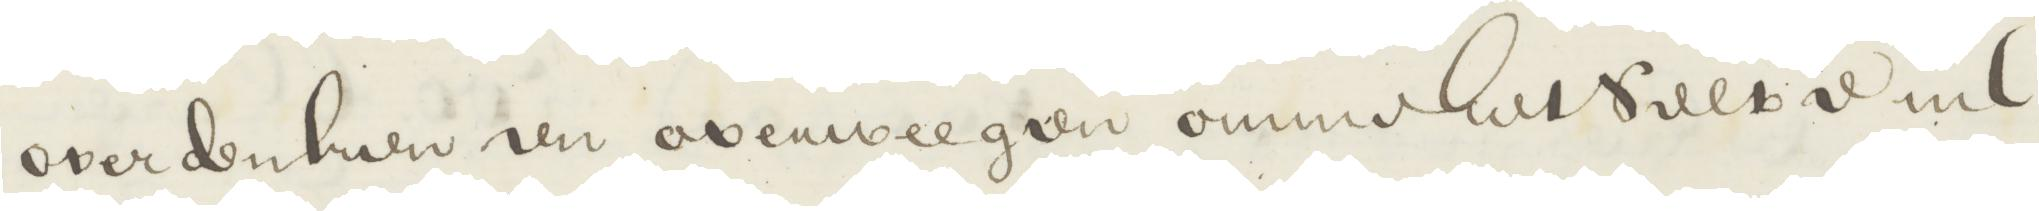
over denken en overweegen omme het selve in't
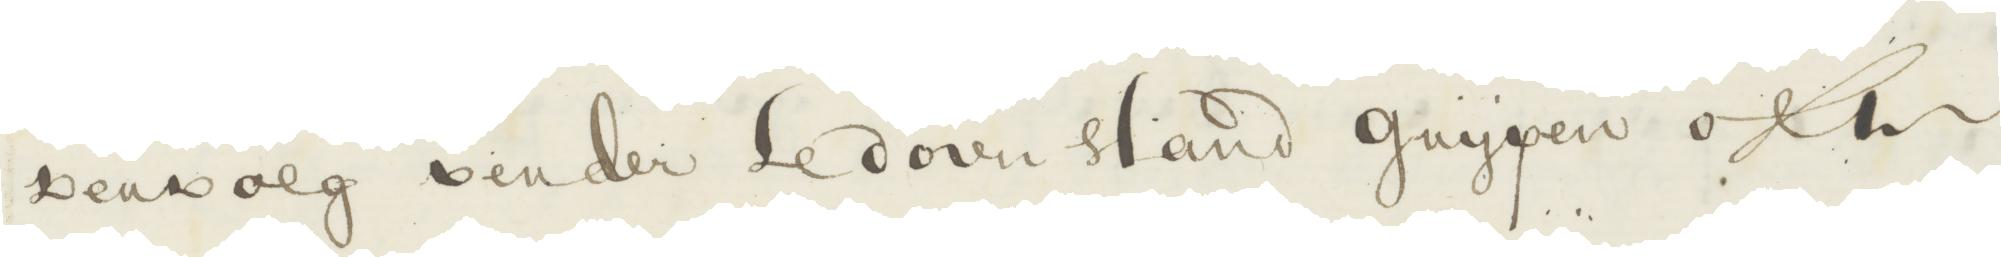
vervolg verder te doen stand grijpen of te
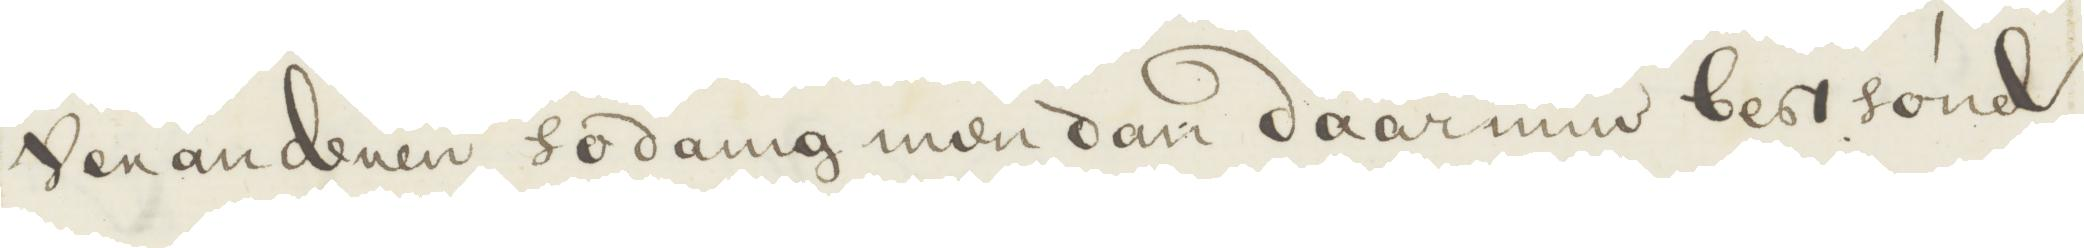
veranderen sodanig men dan daarinne best soude
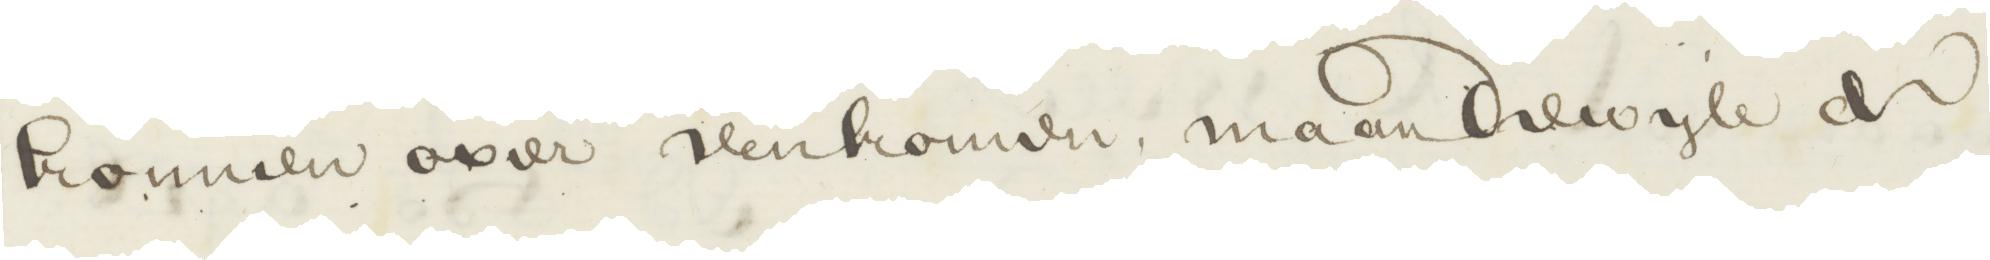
konnen over eenkomen, maar dewijle de
